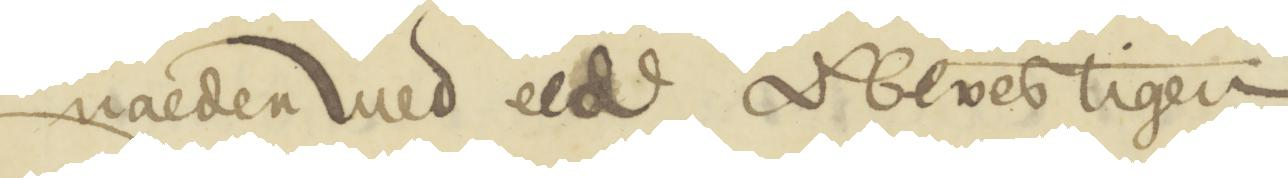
naeder med eede te bevestigen
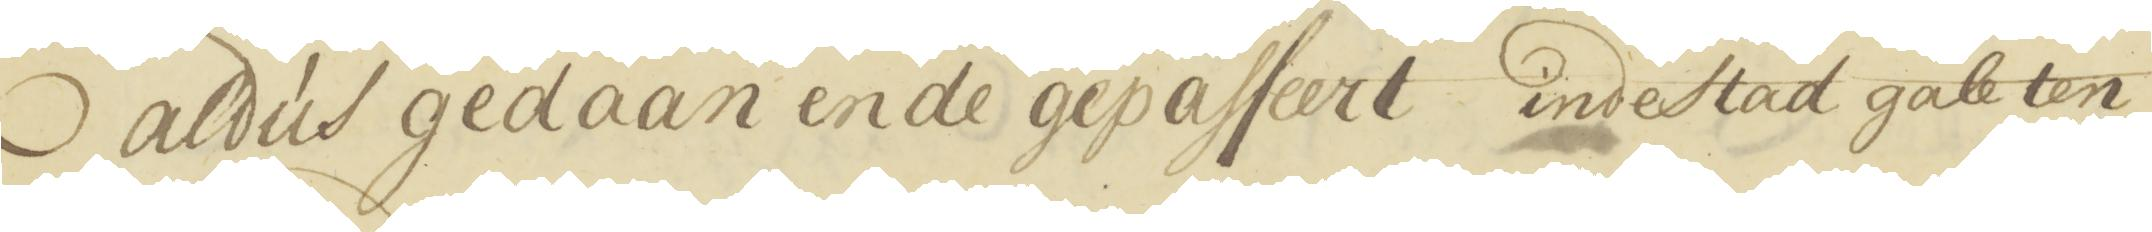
aldus gedaan en de gepasseert in de stad gale ten
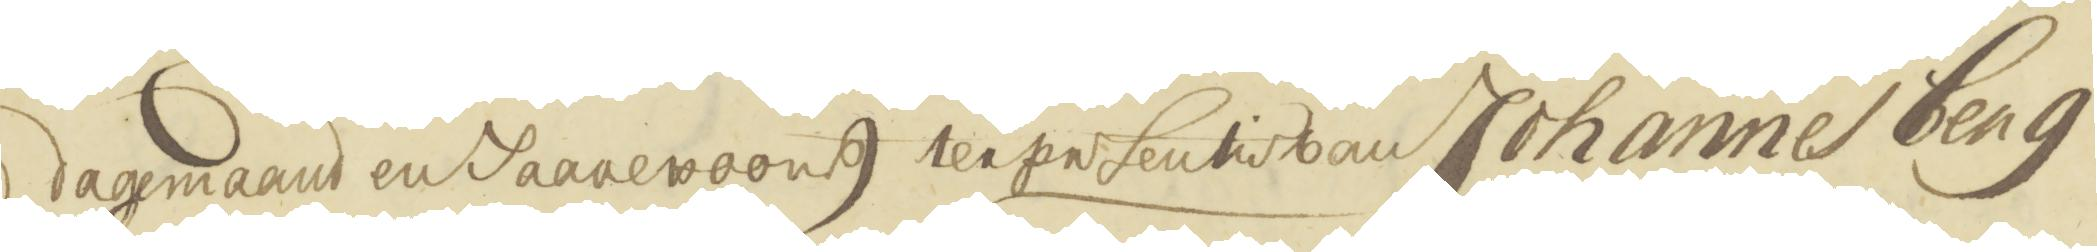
dage maand en Iaare voors ter presentie van Johannes berg
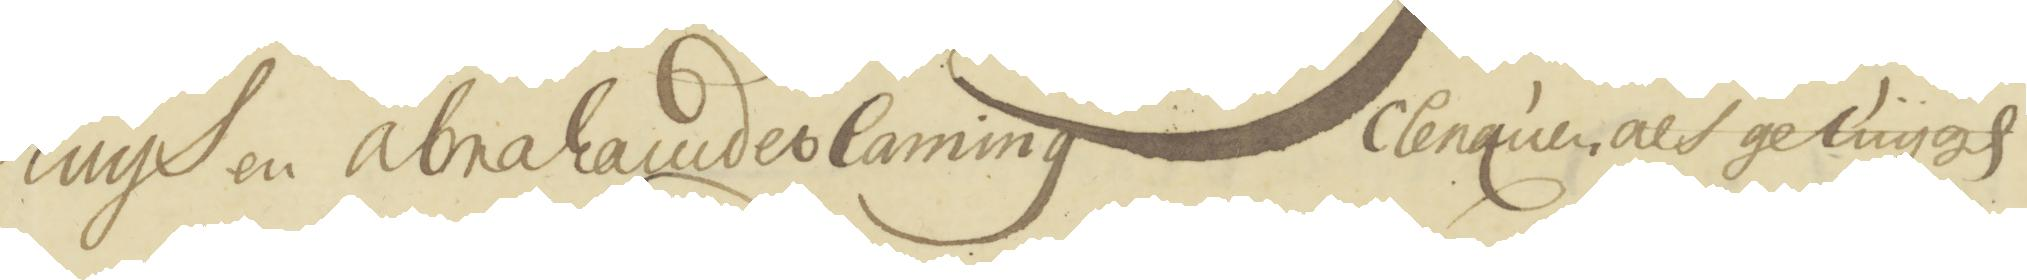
huys en abraham de vlaming Clerquen, als getuijgen
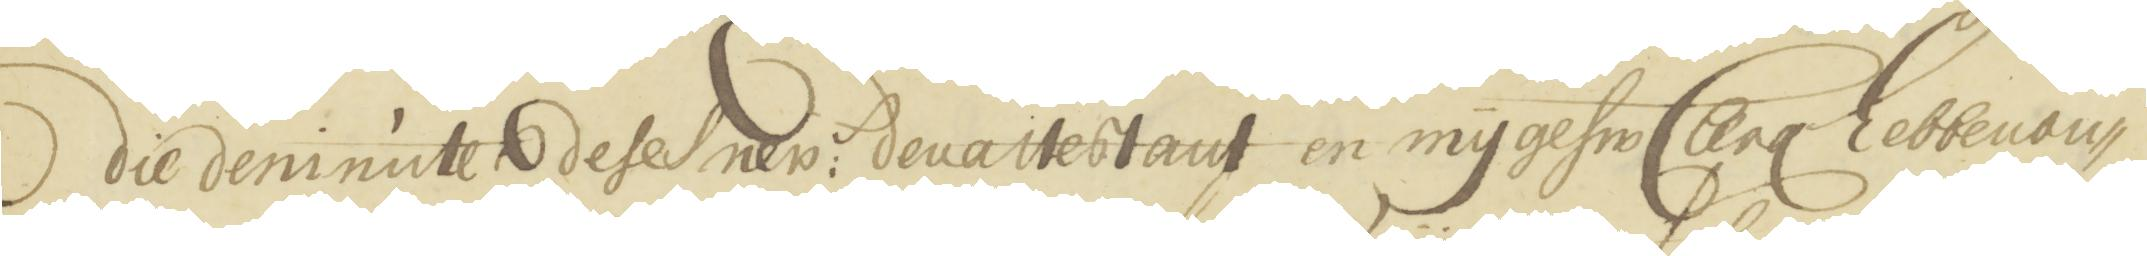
die deninute deses nev:s den attestant en mij gesw Clerq hebben on„
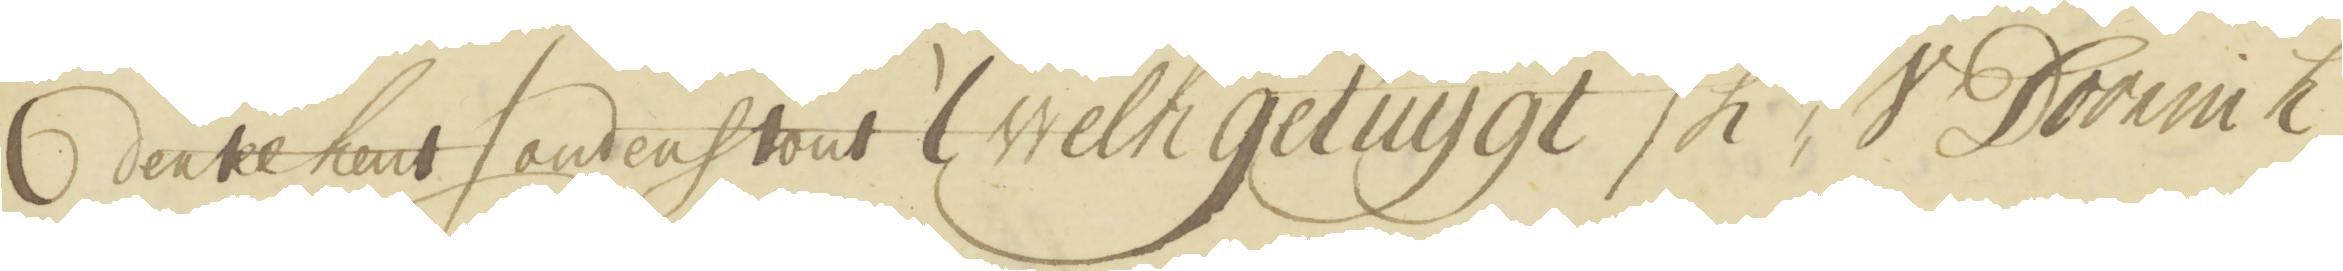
derteekent /onderstont 't welk getuijgt /h„s V Doornik
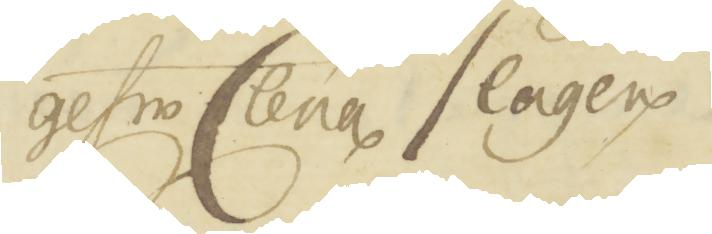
gesw Clerq / lager
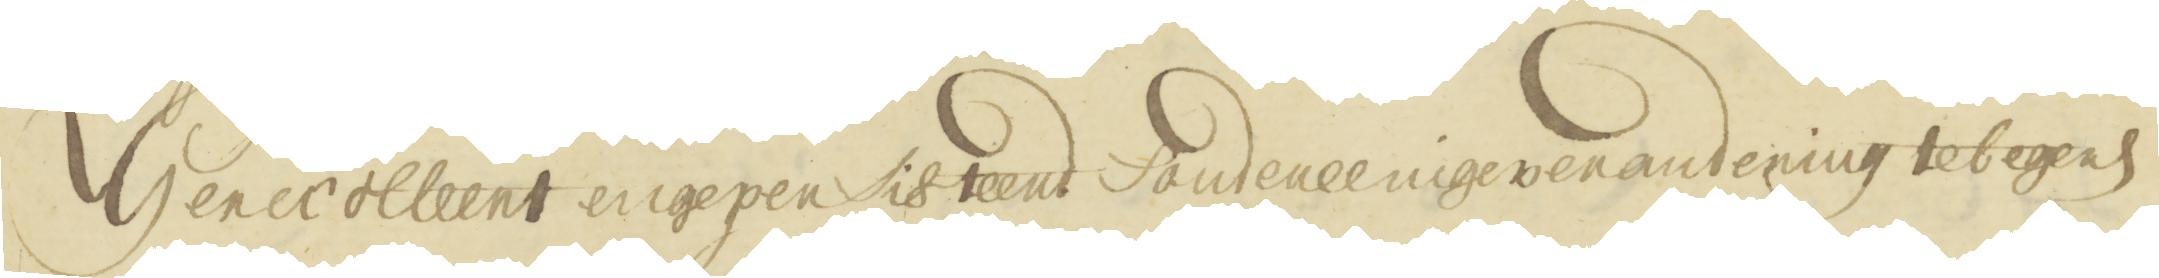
Gerecolleert en gepersisteerd sonder eenige verandering te begeren
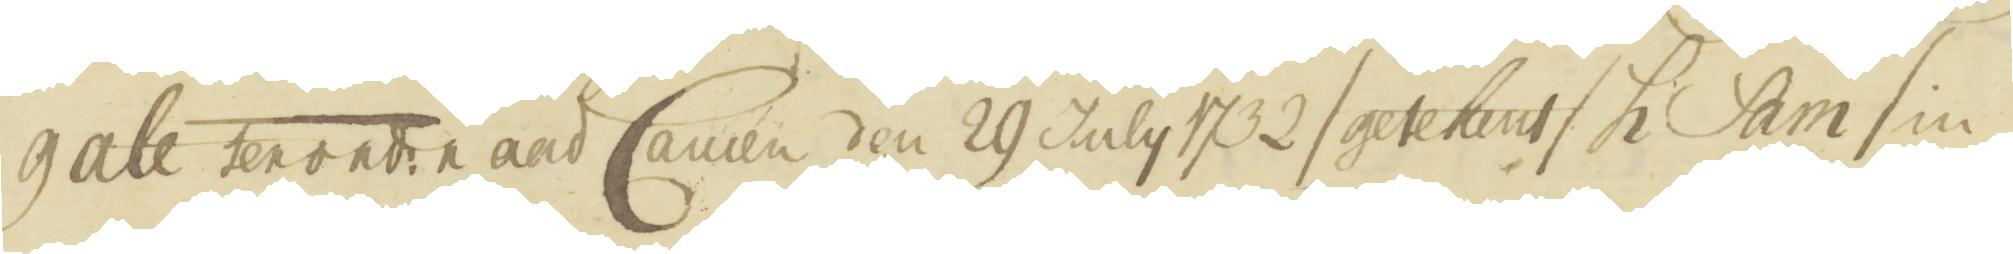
gale terord:raad Camen den 29 Iuly 1732 /getekent / h: Sam /in
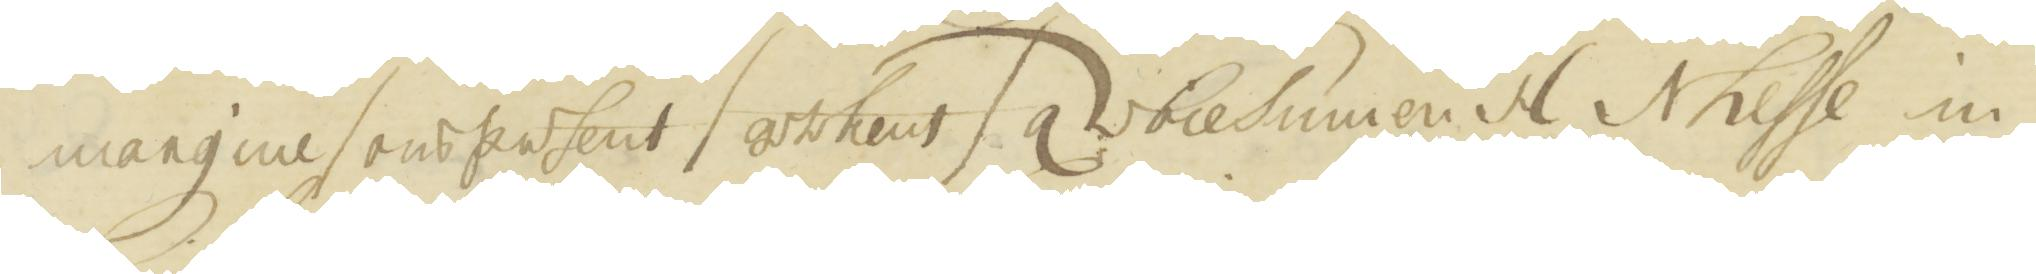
margine /onspresent /:getekent /: q v biesum en H V hesse in
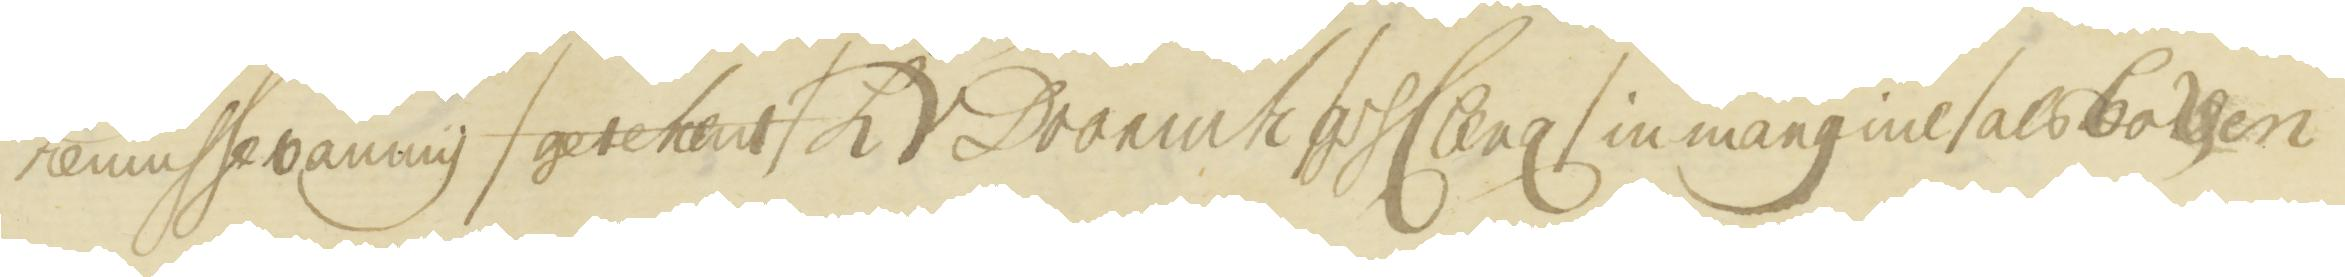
kennisse van mij / getekent/ h V Doornik /ges Clerq/ in margine/ als boven
